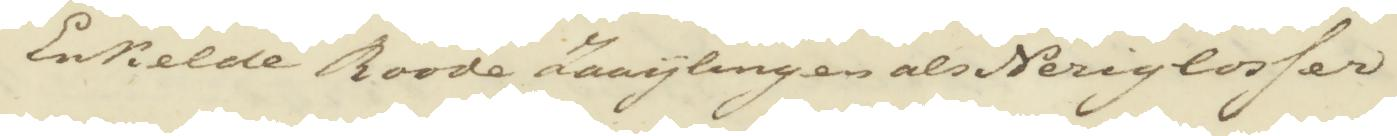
Enkelde Roode Zaaijlingen als Neriglosser
